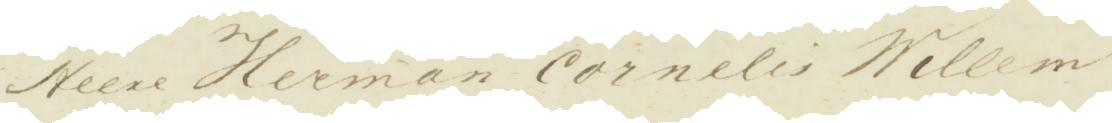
Heere Herman Cornelis Willem
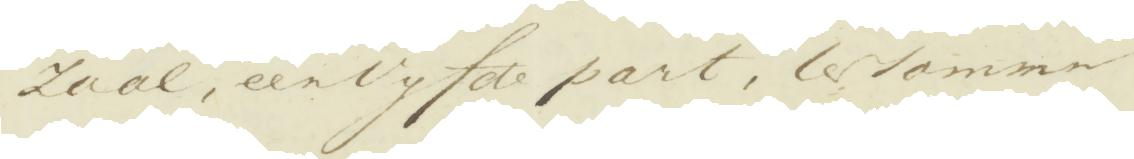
Zaal, eenvyfde part, te somma
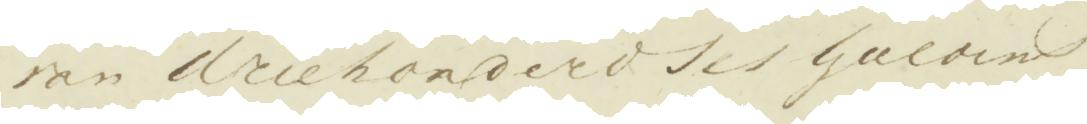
van driehonderd ses Guldens
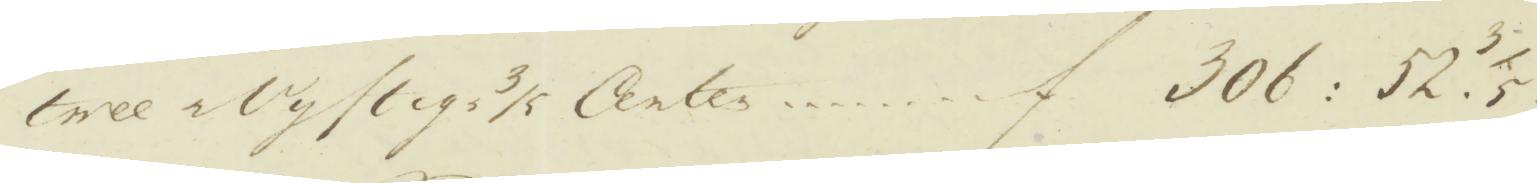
twee en vyftig en 3/5 Centen .......ƒ 306: 52.3/5
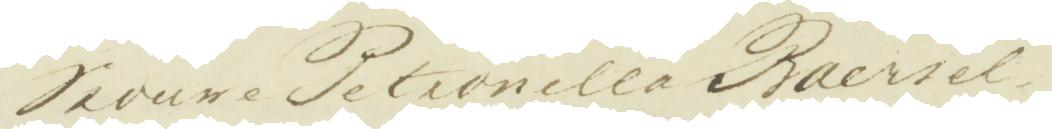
Vrouwe Petronella Baersel„
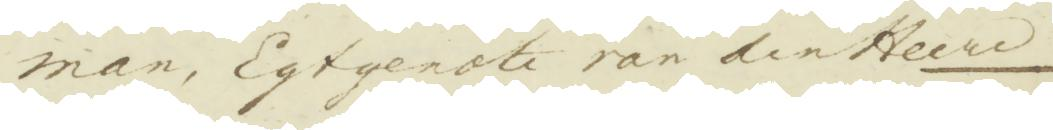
man, Egtgenote van den Heere
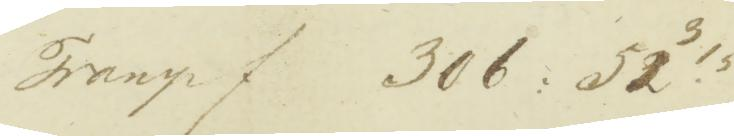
Transp ƒ 306 : 52.3/5
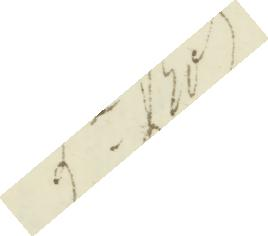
5„e Rol
